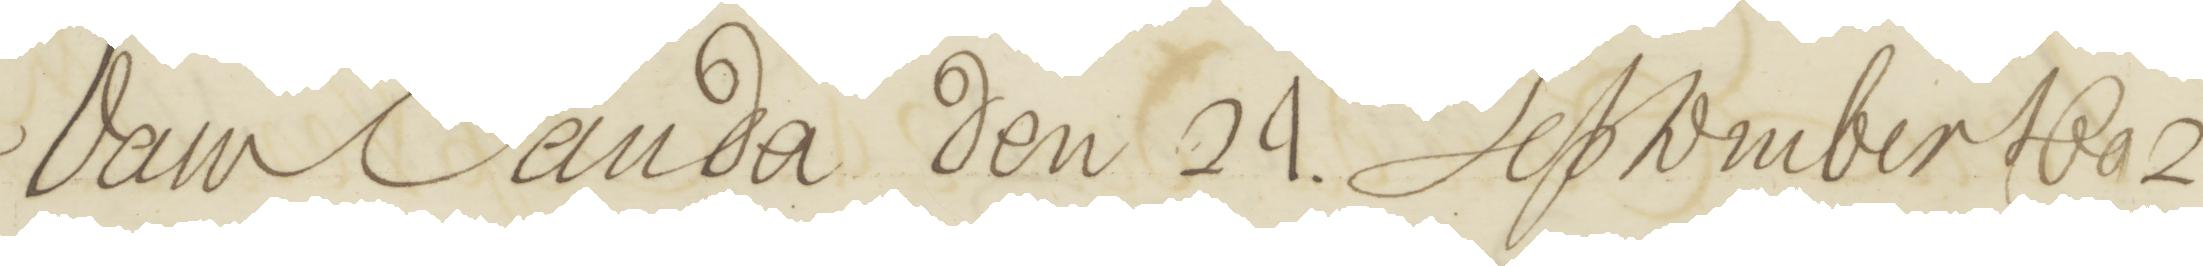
Van Banda den 24.n September 1692
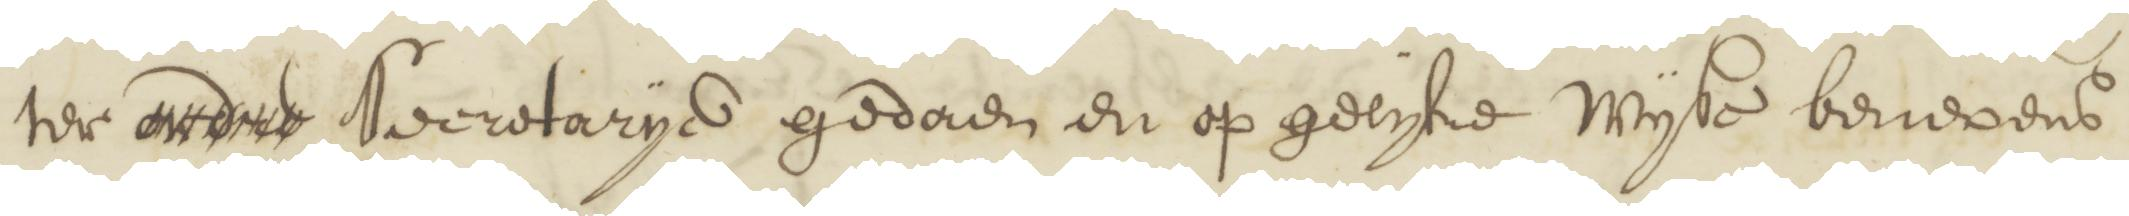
ter ordre secretarije gedaen en op gelijke wijse benevens
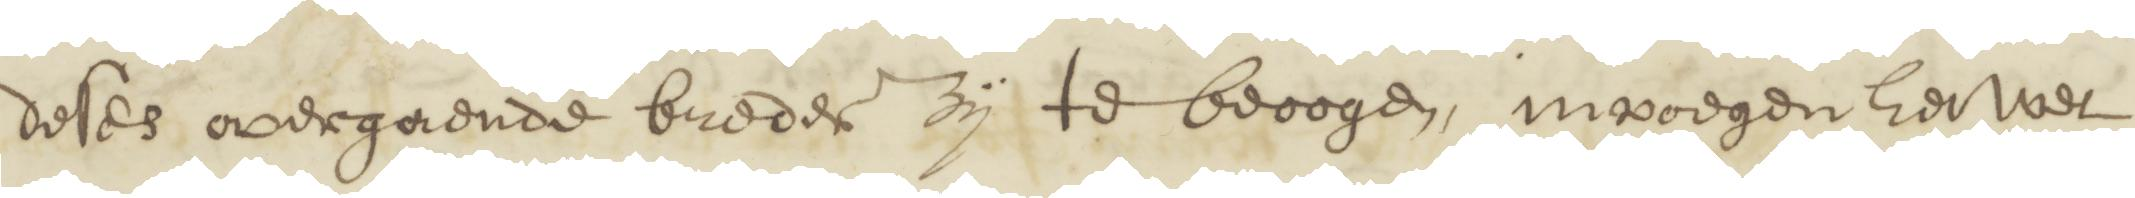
deses overgaende breder zij te beoogen, invoegen het wel
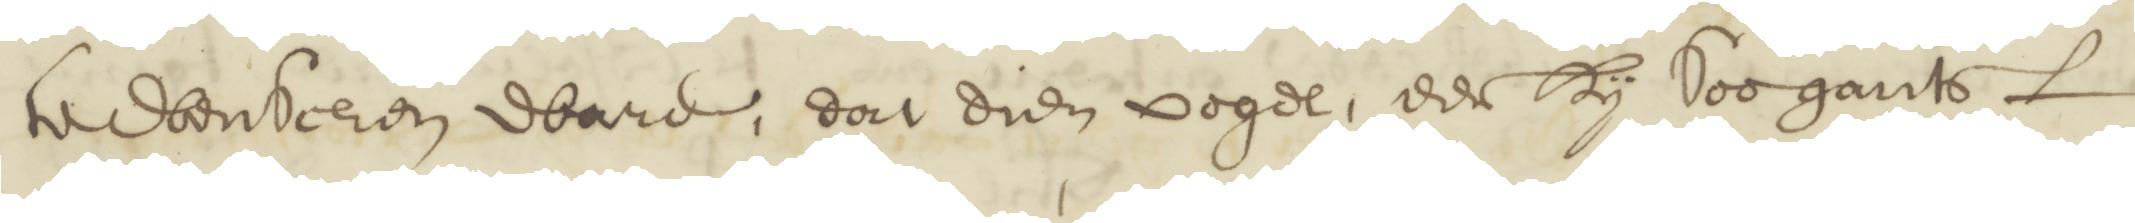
te wenschen ware, dat dien vogel, eer hij soogantst
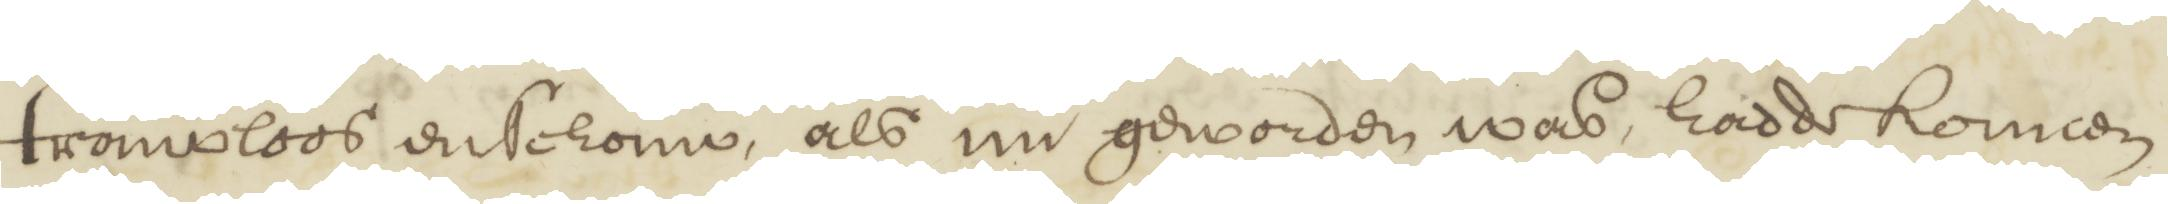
trouwloos en schouw, als nu geworden was, hadde konnen
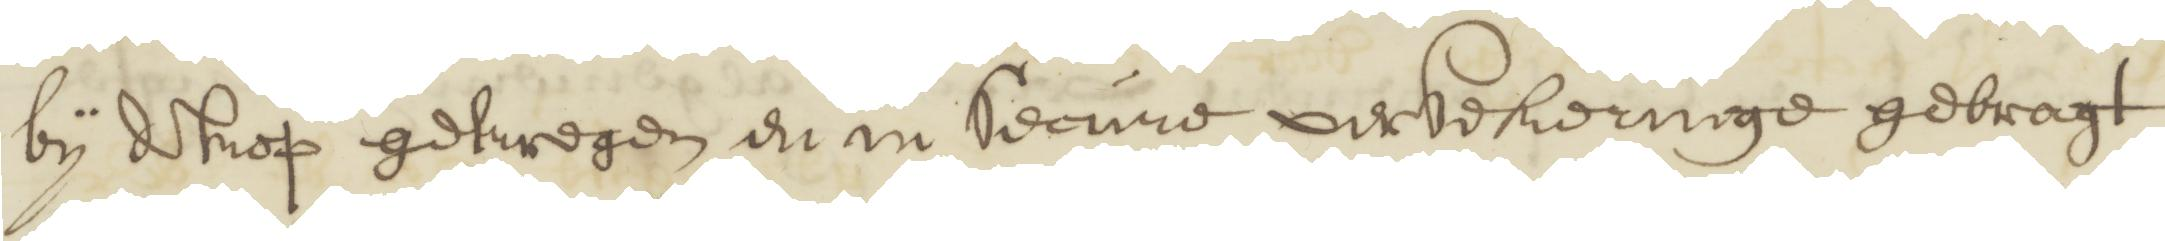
bij de kop gekregen en in secure versekeringe gebragt
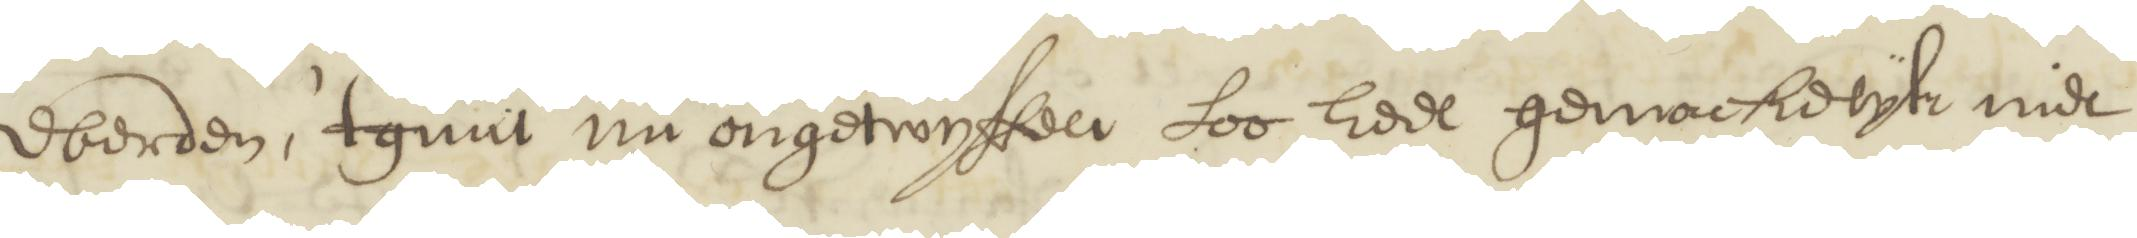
werden, 't gunt nu ongetwijffelt soo heel gemackelijk niet
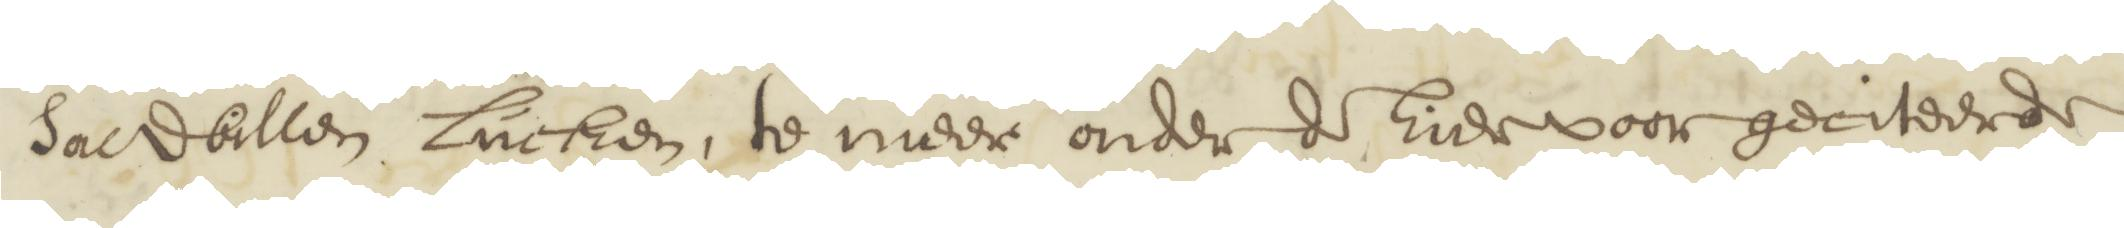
sal willen lucken, te meer onder de hiervoor geciteerde
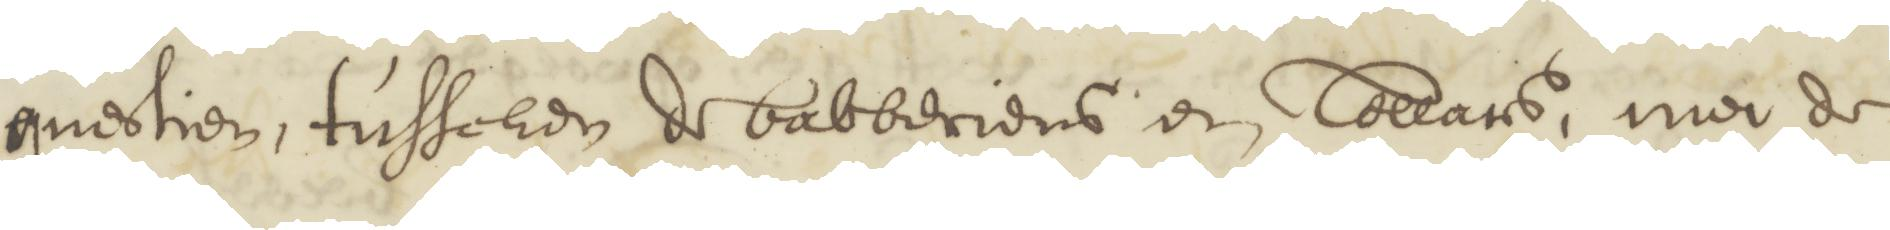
questien, tusschen de babberiens en Tellars, met de
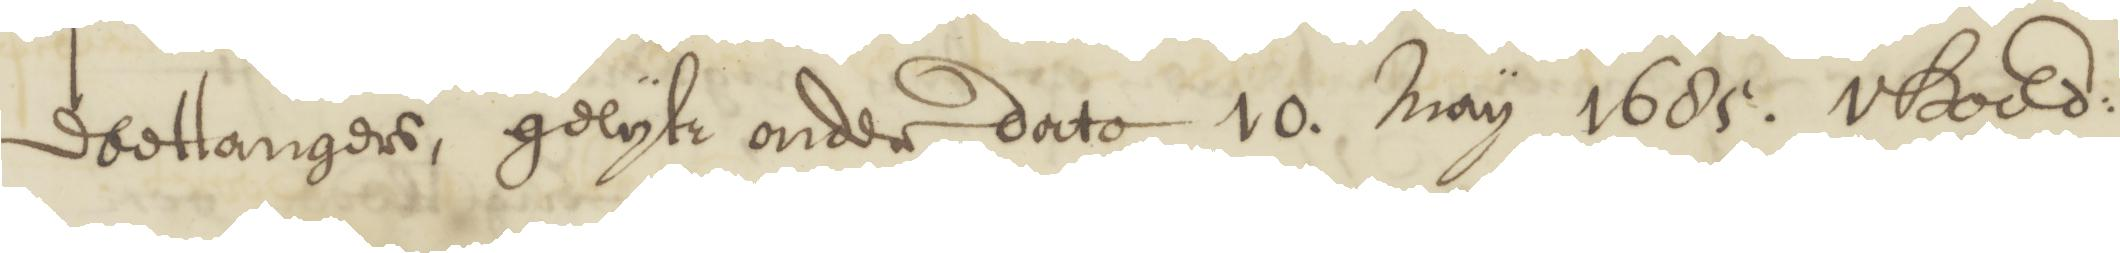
Ebettangers, gelijk onder dato 10. maij 1685. VHoEd:
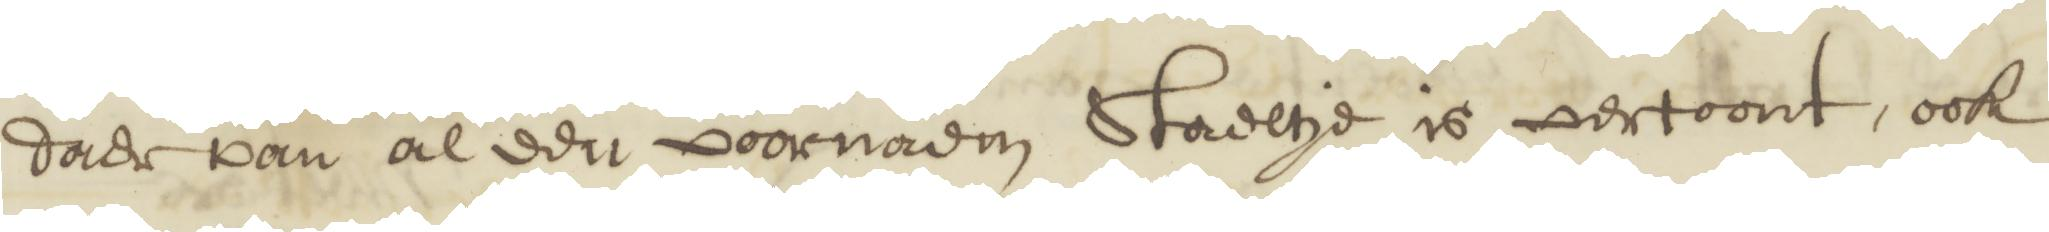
daer van al een voornaem staeltje is vertoont, ook
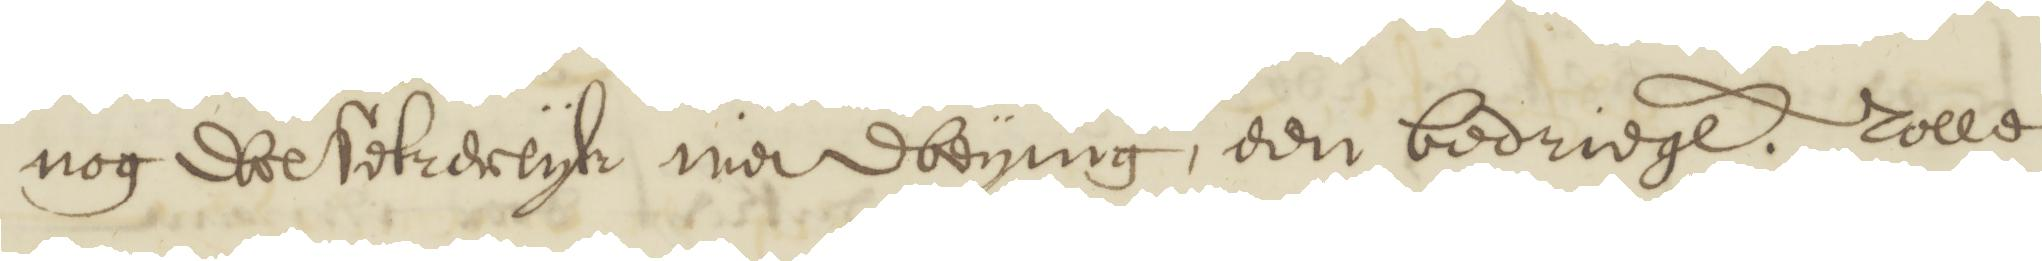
nog wesekerlijk niet weijnig, een bedriegl: zolle
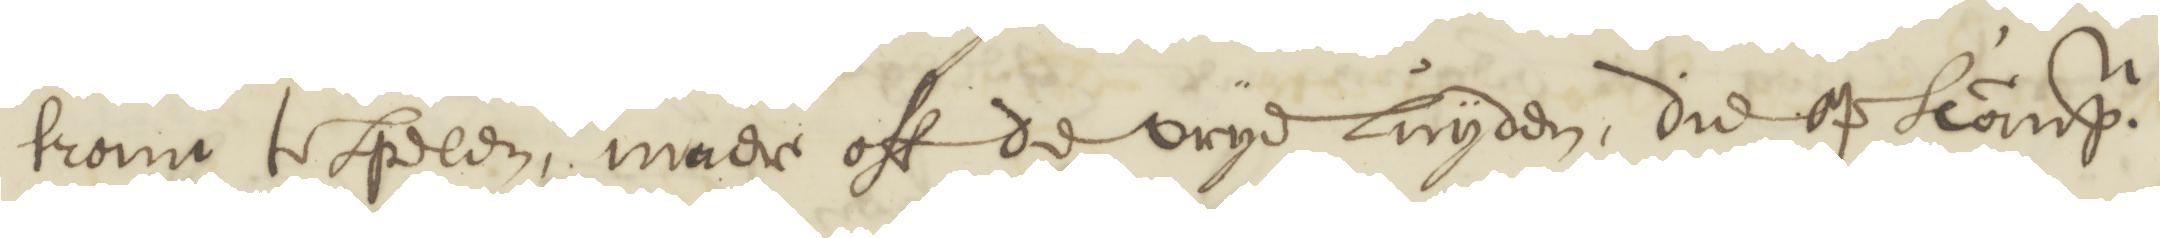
komt tespelen, maer off de vrije luijden, die op s'comp:n
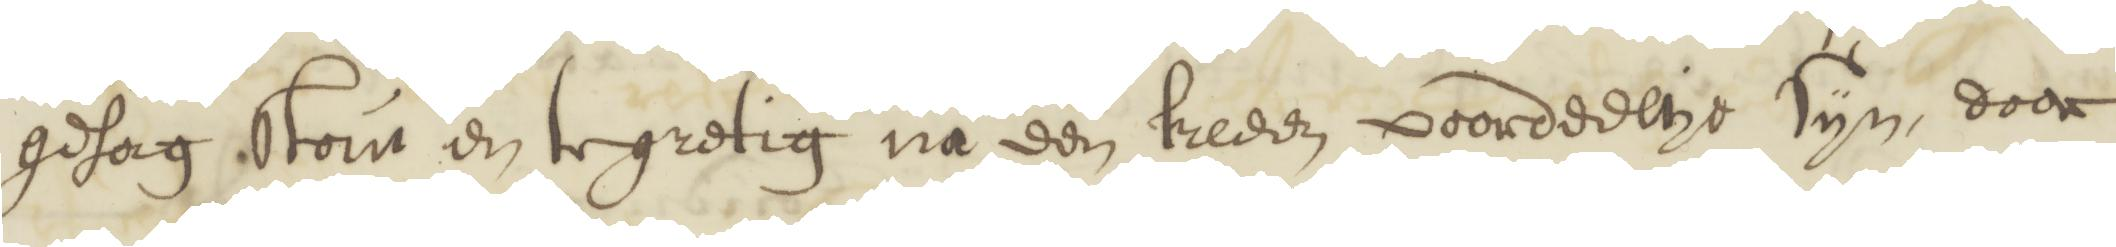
gesag stout en te gretig na een kleen voordeeltje sijn, door
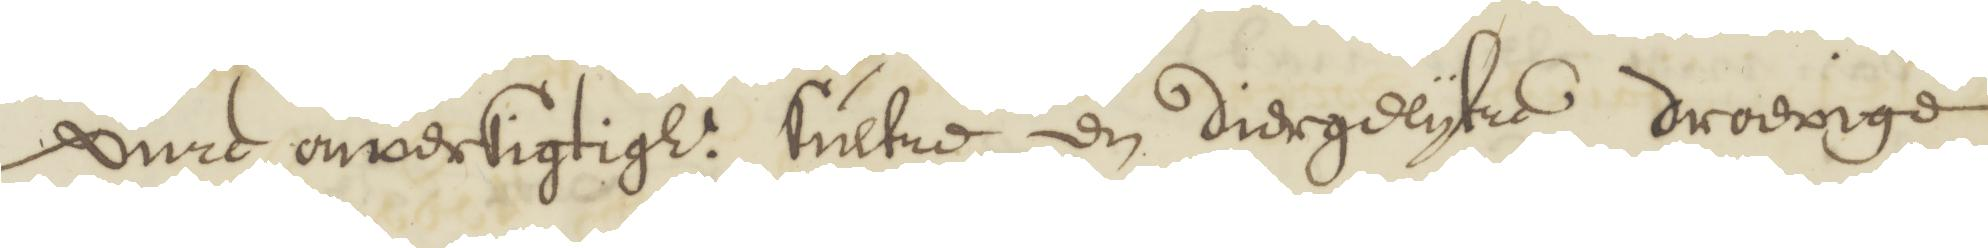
pure onversigtigh.t sulke en diergelijke droevige
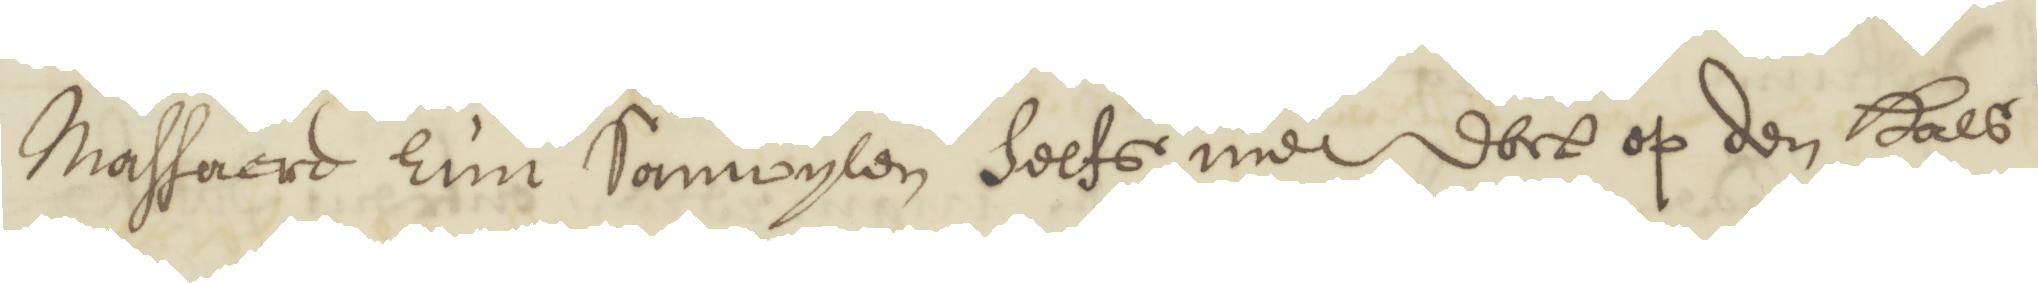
Massacre hun Somwijlen selfs niet wel op den hals
